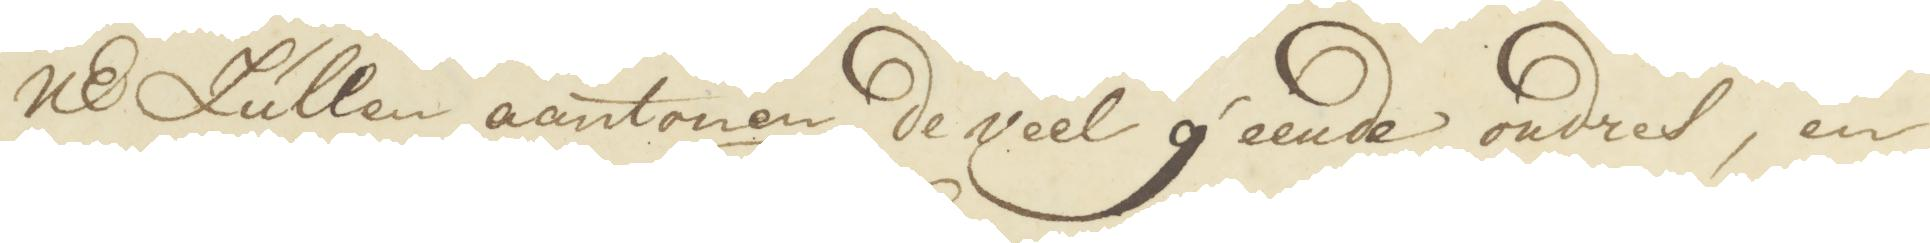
uE zullen aantonen, de veel g’eerde ordres, en
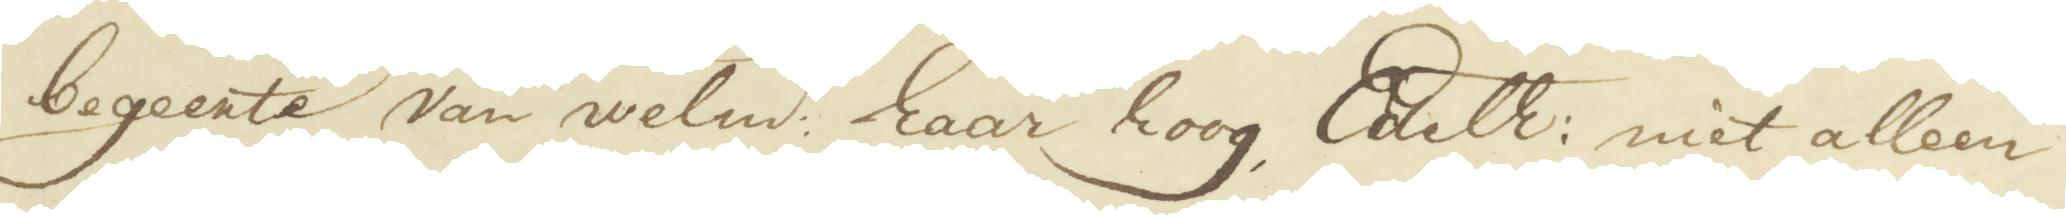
begeerte van welm: haar hoog Edelh: niet alleen
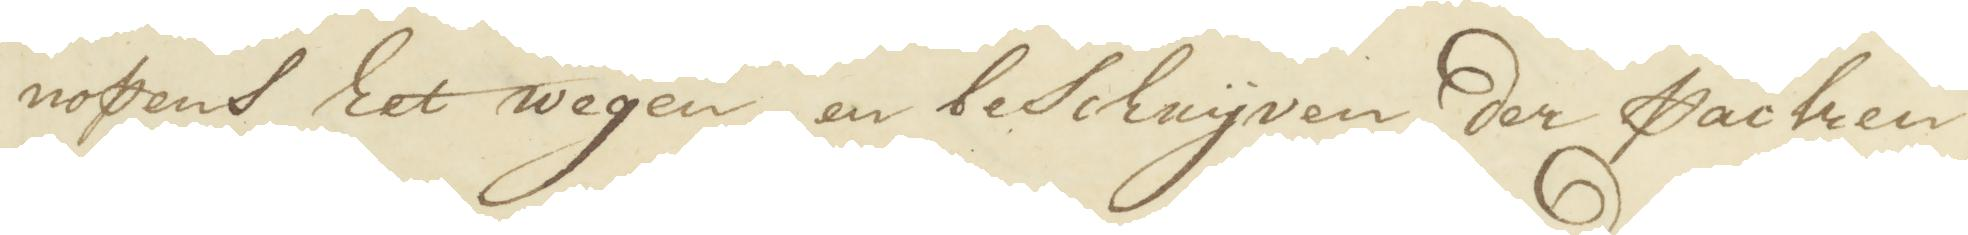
nopens het wegen, en beschrijven der packen
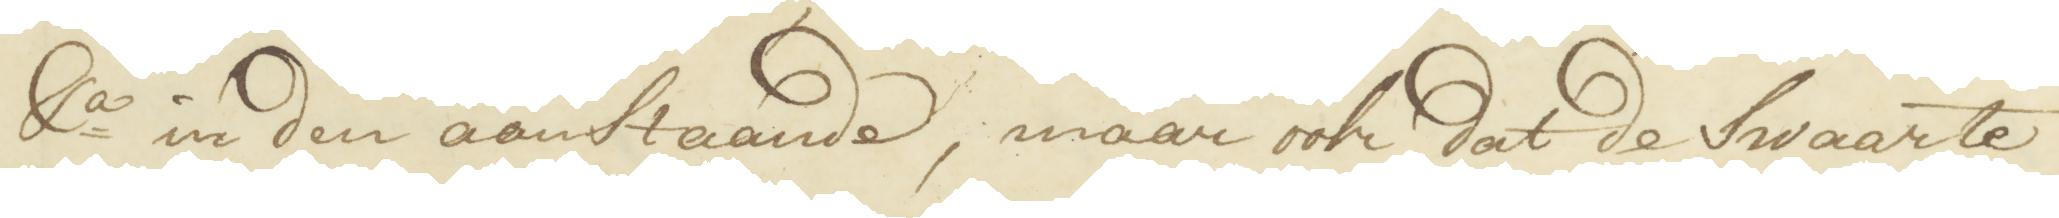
Et=a in den aanstaande, maar ook dat de swaarte
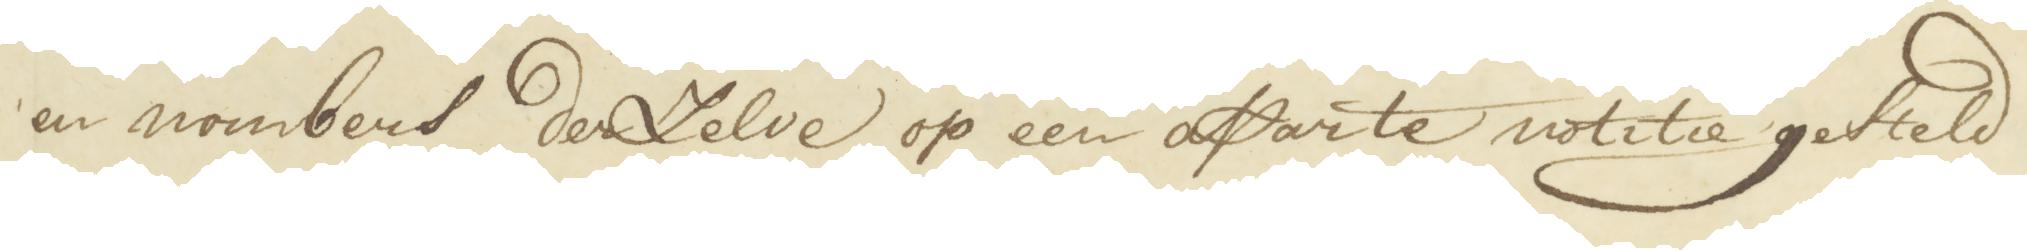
en nombers derzelve op een aparte notitie gesteld
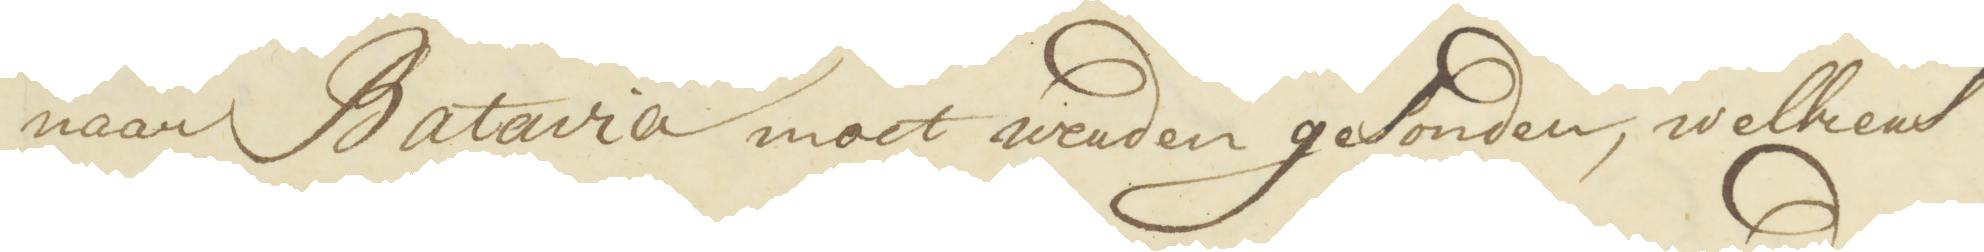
naar Batavia moet werden gesonden, welkens
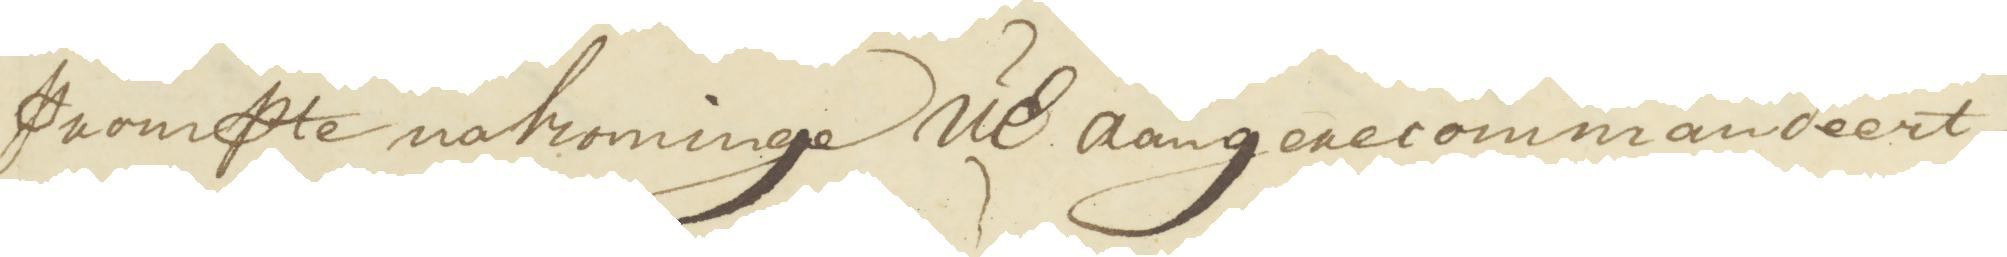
prompte nakominge UE: aangerecommandeert
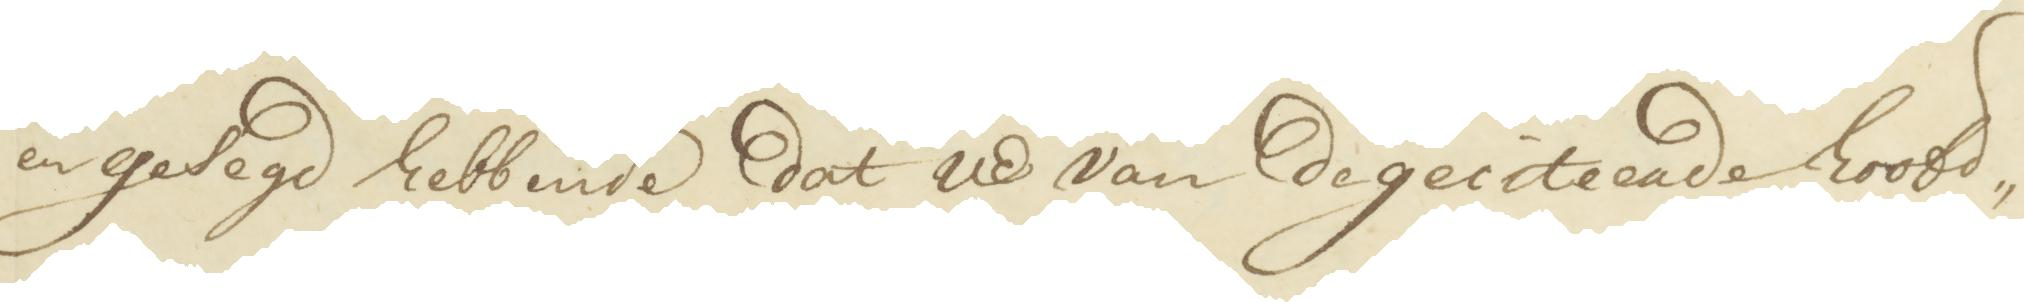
en gesegd hebbende dat uE van de geciteerde hoofd„
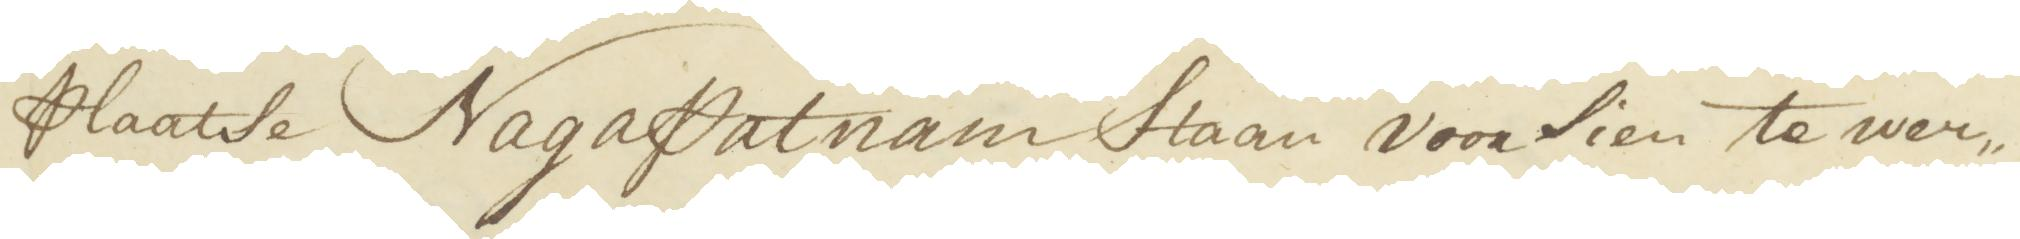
plaatse Nagapatnam staan voorsien te wer„
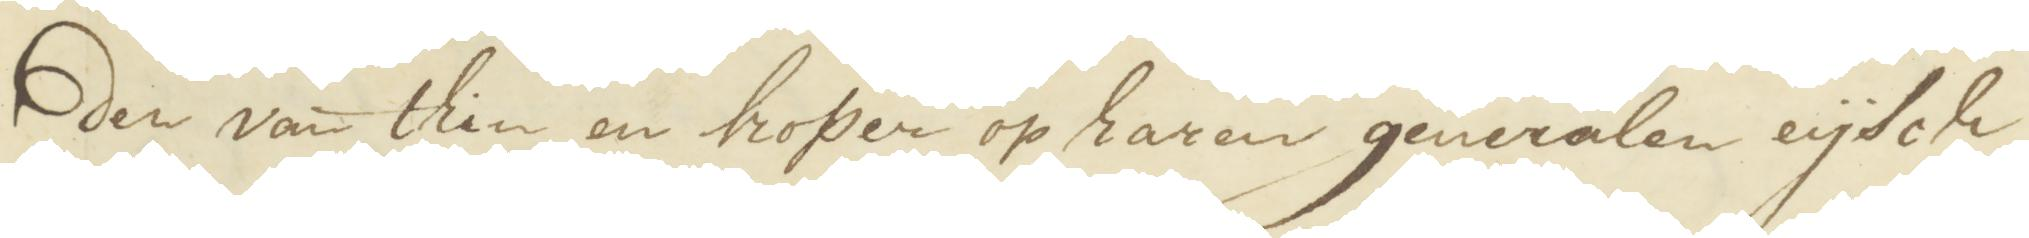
den van thin en koper op haren generalen eijsch
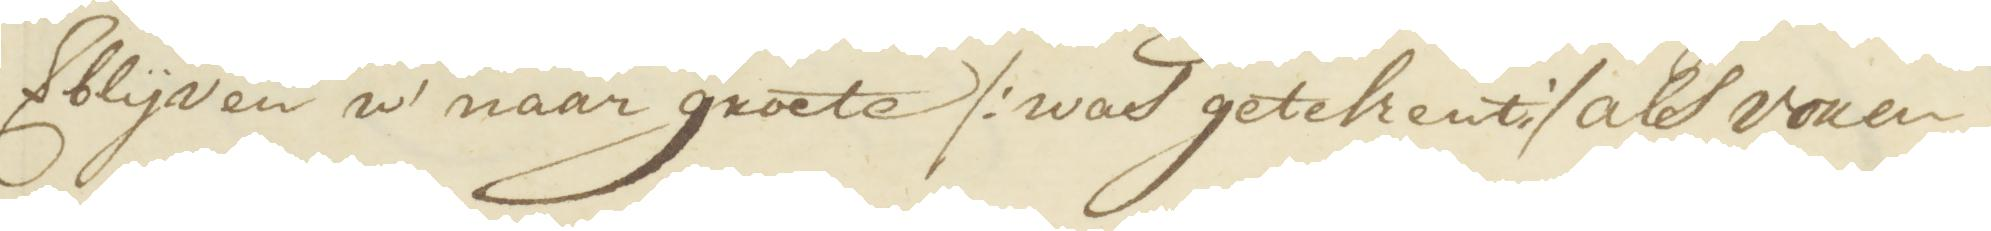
verblijven w' naar groete /:was getekent:/ als voren
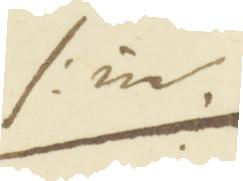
/:in./.
